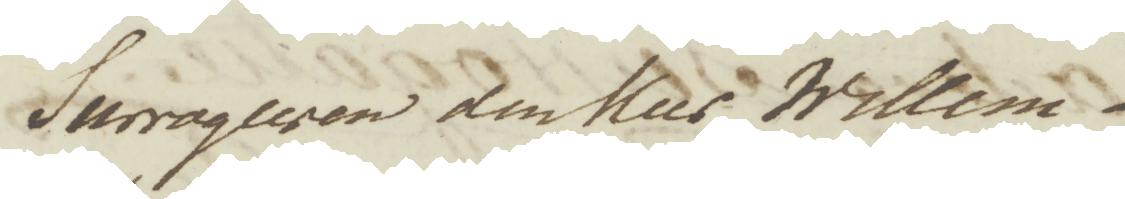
Surrogeeren den Heer Willem
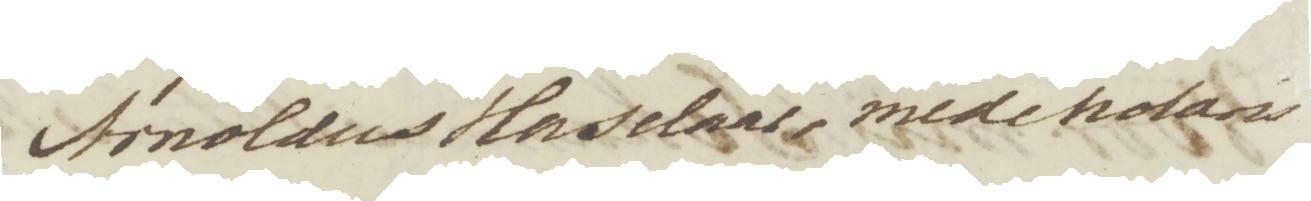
Arnoldus Haselaar, mede notaris
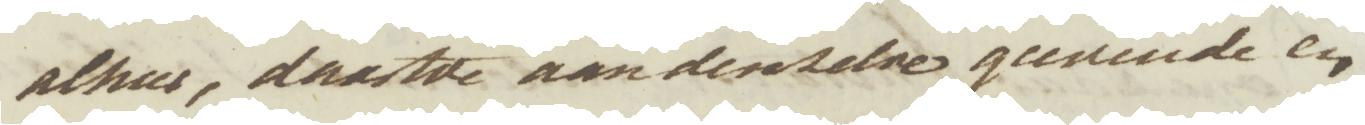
alhier, daartoe aan denzelve geevende en
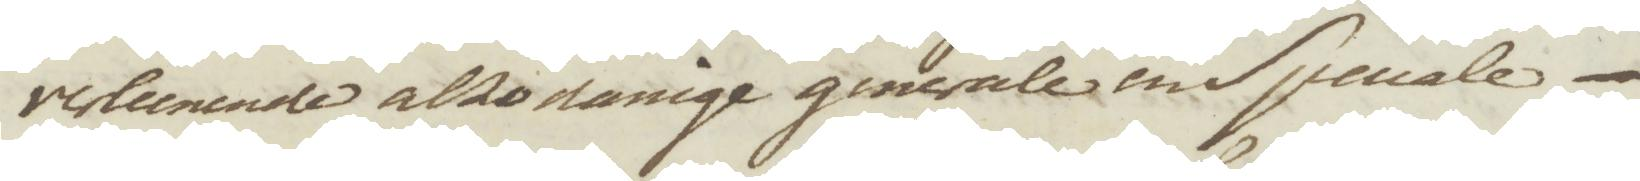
verleenende alzo danige generale en Speciale -
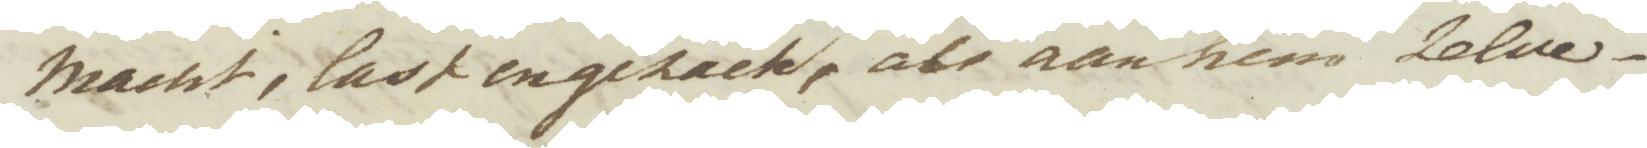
macht, last en gezach, als aan hem zelve -
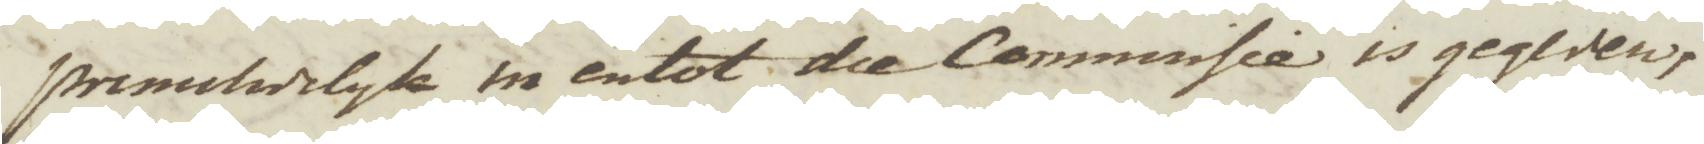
prenaturlyk in en tot die commissie is gegeven,
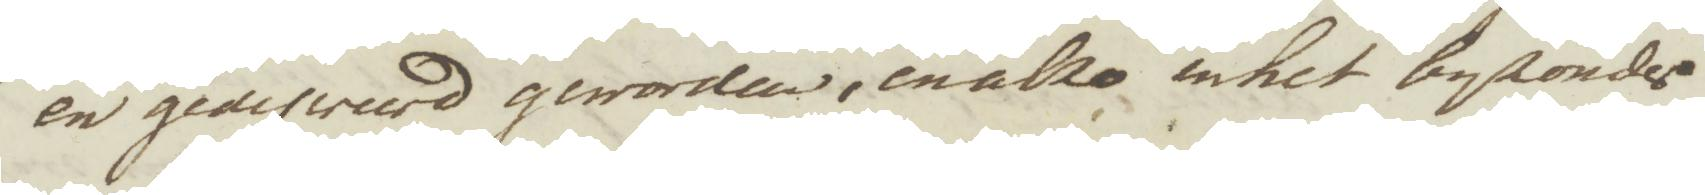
en gedesereerd geworden, en alzo in het byzonder
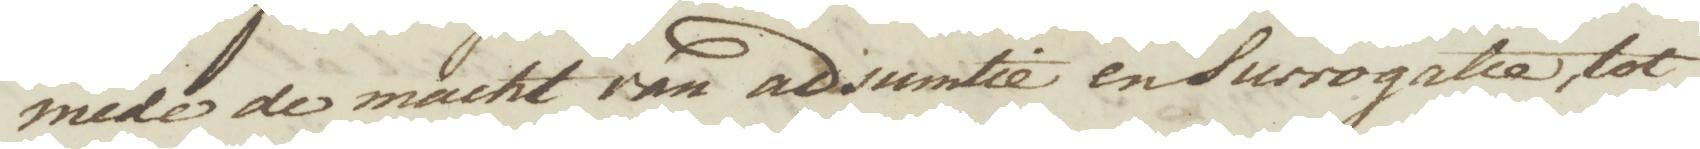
mede de macht van adsumtie en surrogatie, tot
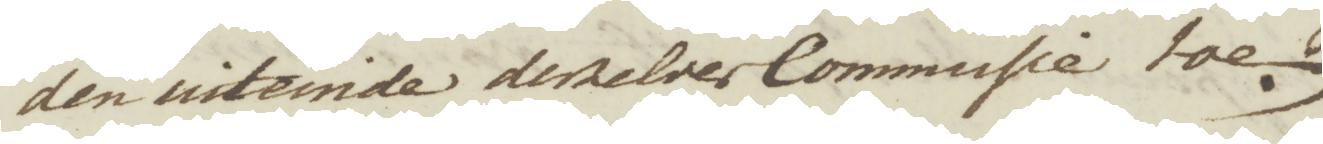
den uiteinde derzelve commissie toe.
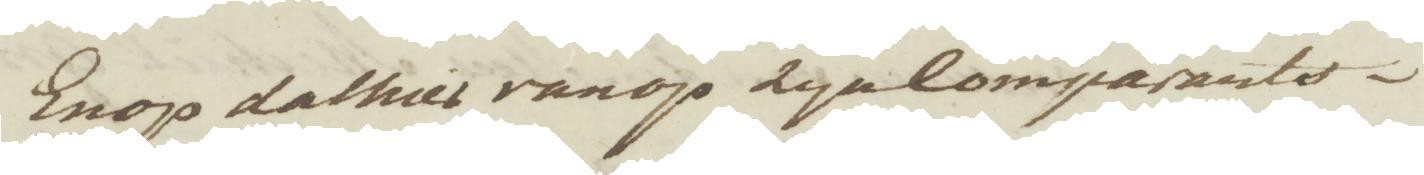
En op dathier van op zijn comparants
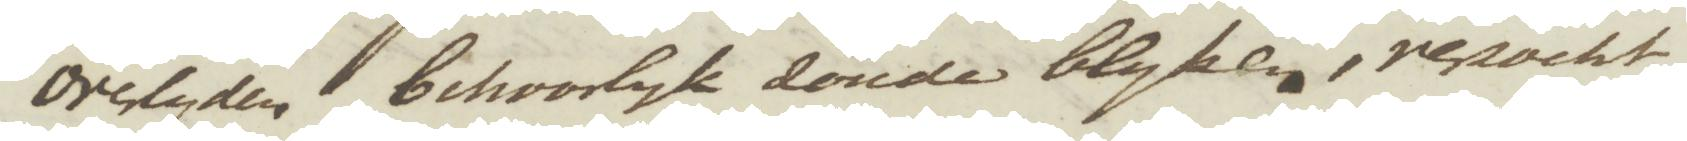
overlyden behoorlyk zoude blyken, verzoekt
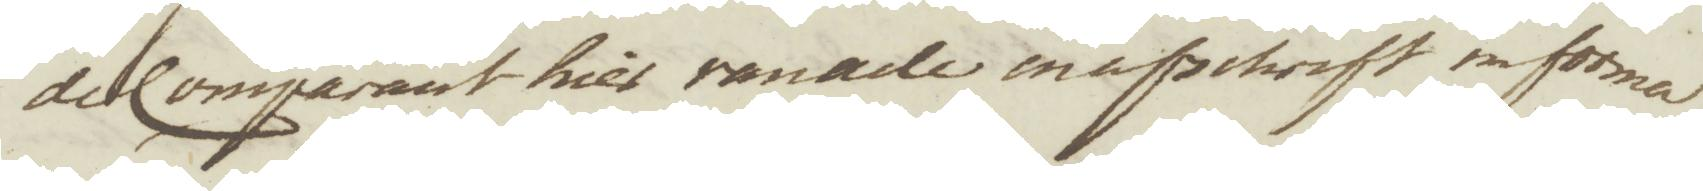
de Comparant hier van ade en afschrift informa
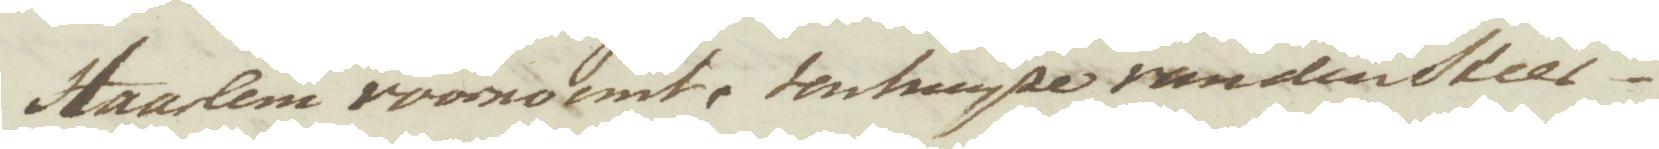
Haarlem voornoemt, ten huijse van den Heer
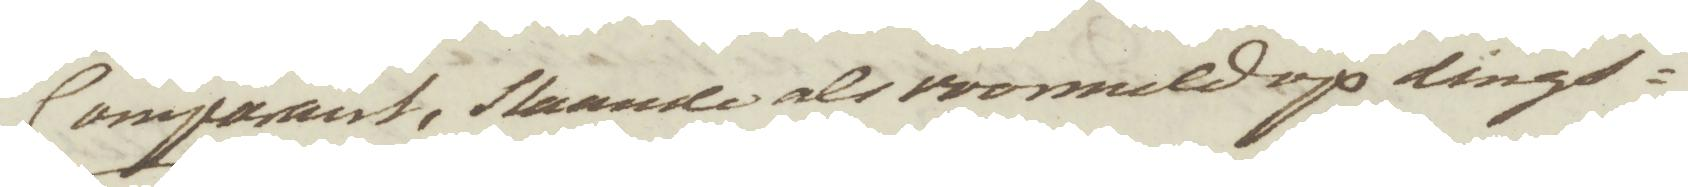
Comparant, staande als voormeld op dings=
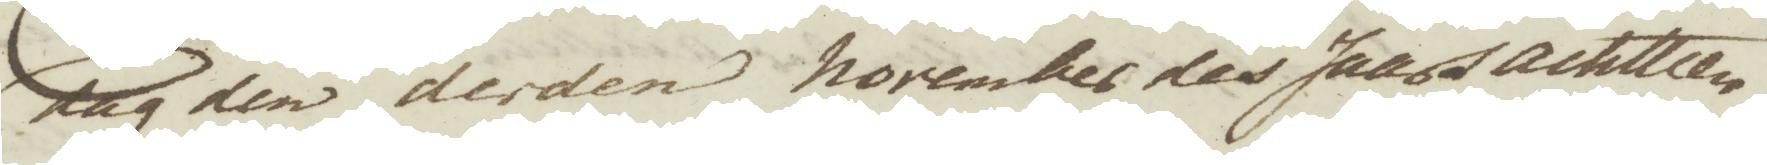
dag den derden November des Jaars achttien
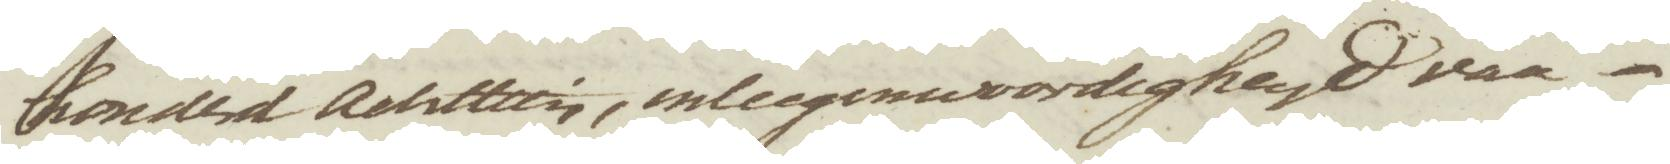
honderd achttien, inteegenwoordigheijd van
